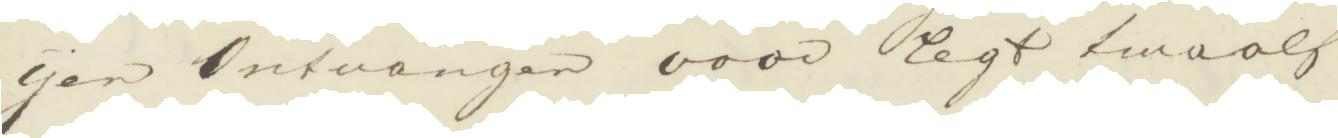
ijen Ontvangen voor regt twaalf
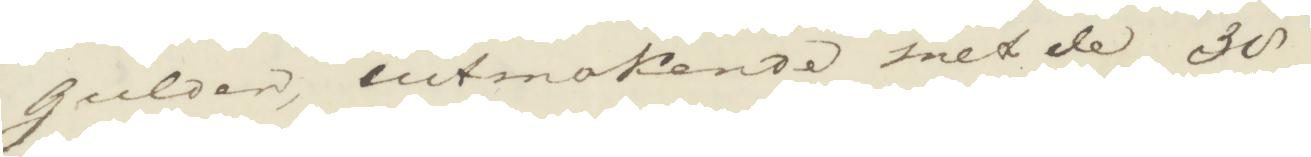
gulden, uitmakende met de 38
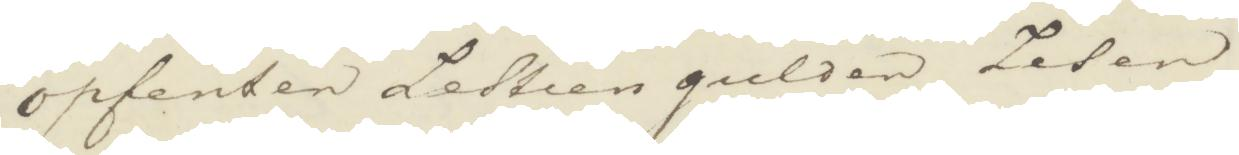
opCenten Zestien gulden Zes en
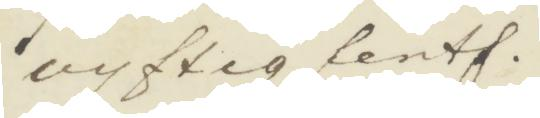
vyftig Cents.
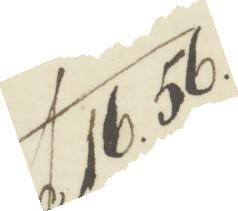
ƒ 16.56.
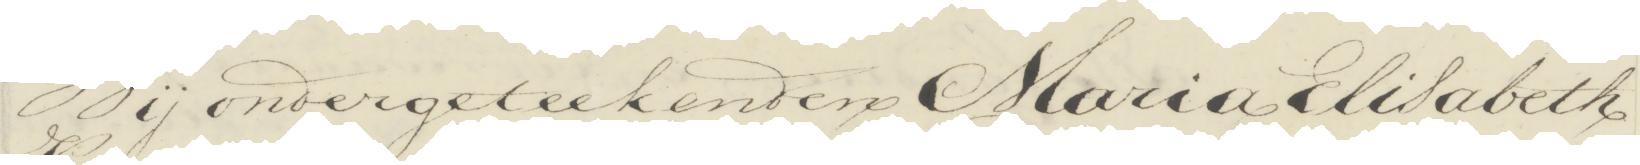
Wij ondergeteekenden Maria Elisabeth
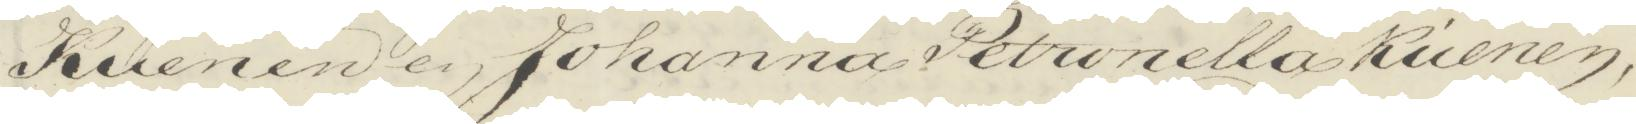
Kuenen en Johanna Petronella Kuenen,
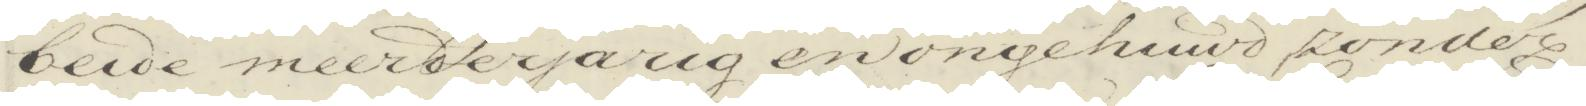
beide meerderjarig en ongehuwd zonder
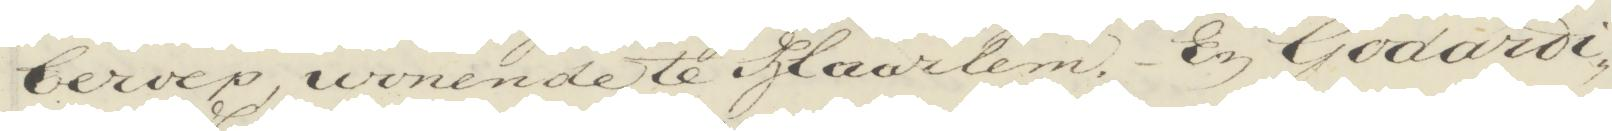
beroep, wonende te Haarlem, en Godardi
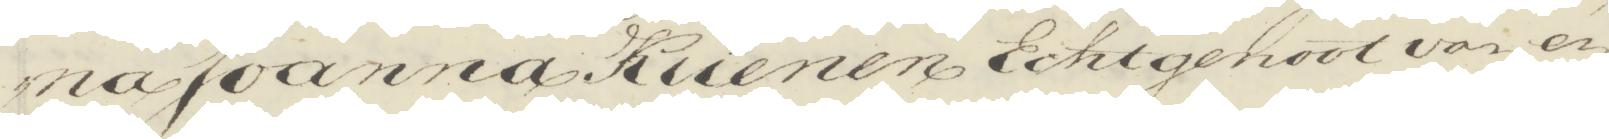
na Joanna Kuenen Echtgenoot van en
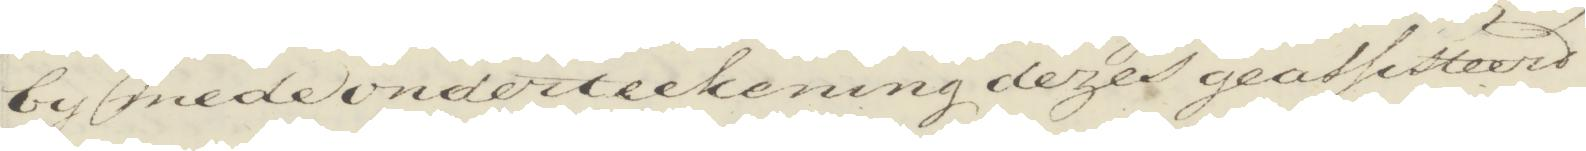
by mede onderteekening dezes geassisteerd
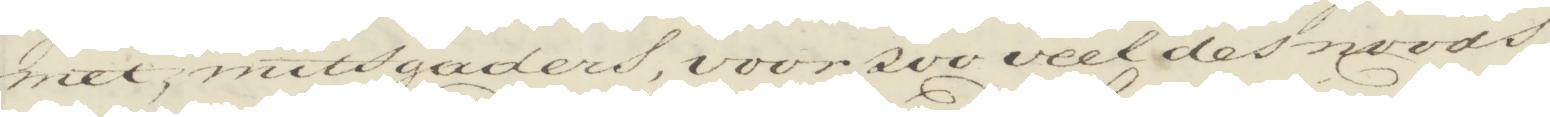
met, mitsgaders, voor zoo veel des noods,
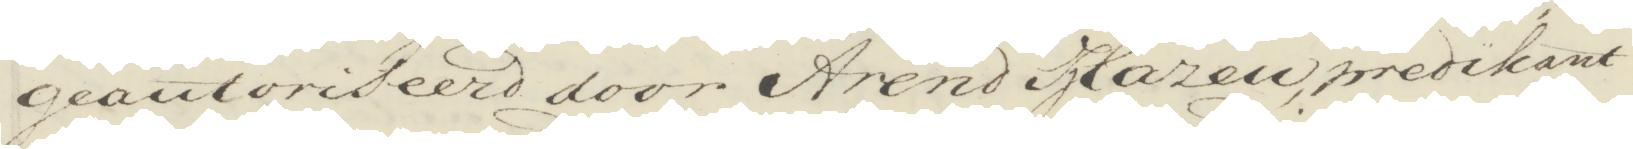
geautoriseerd door Arend Hazeu, predikant
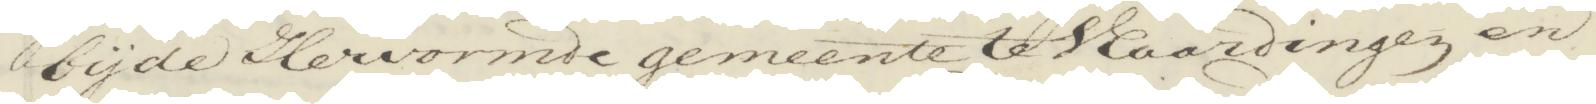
bij de Hervormde gemeente te Vlaardingen en
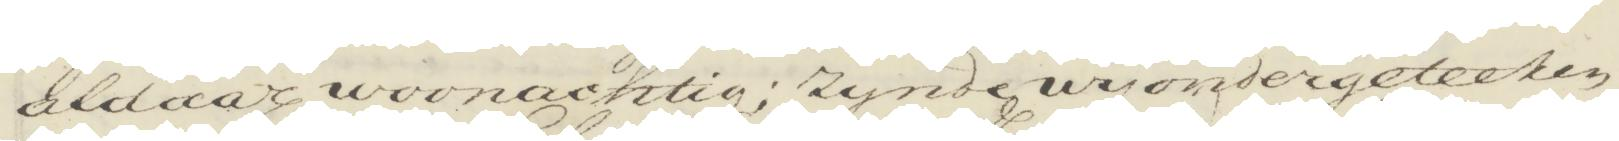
aldaar woonachtig; zijnde wij ondergeteeken
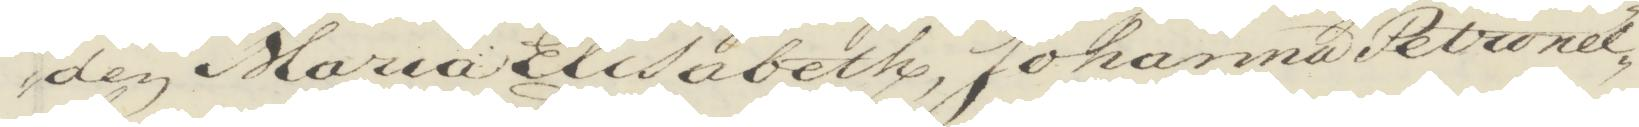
„den Maria Elisabeth, Johanna Petronel„
